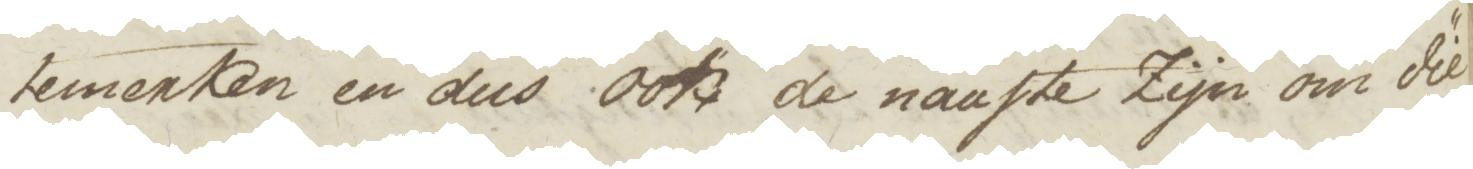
temerken en dus ook de naaste zijn om die
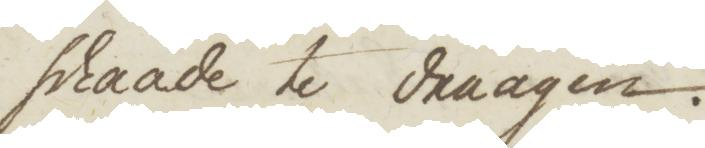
schaade te draagen.
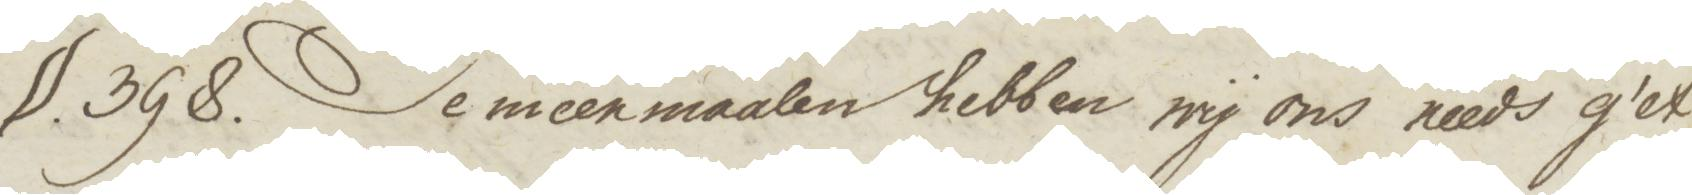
§. 398. Te meermaalen hebben wij ons reeds g’ex
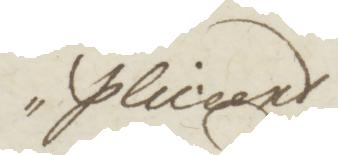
„pliceert
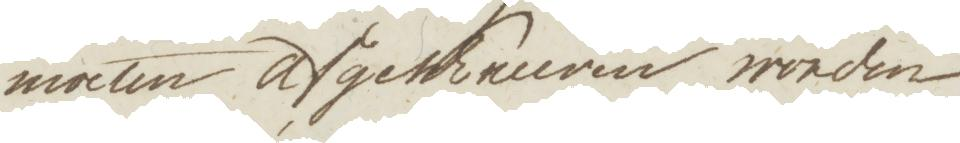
moeten afgeschreeven worden
